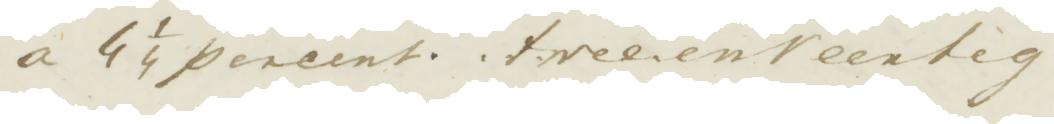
a 4¼ percent twee en Veertig
